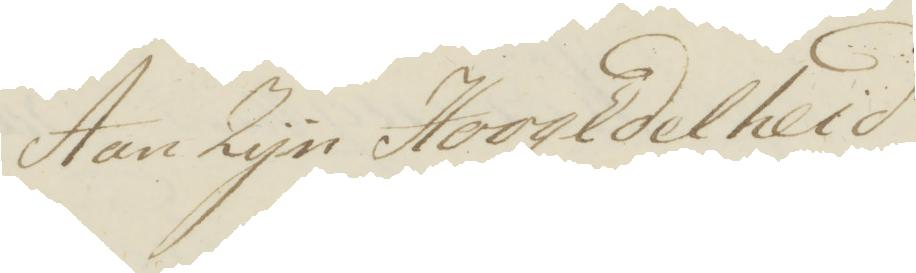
Aan Zijn Hoog Edelheid
